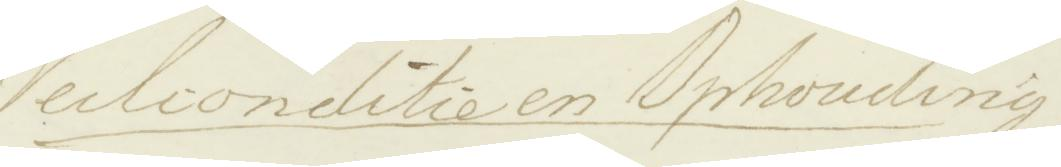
Veilconditie en Ophouding
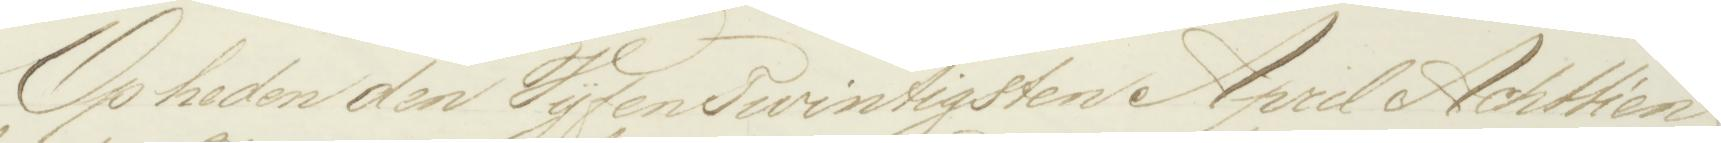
Op heden den Vijfen Twintigsten April Achttien
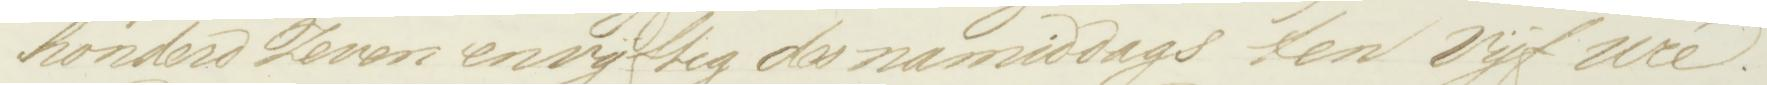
honderd Zeven en vijftig des namiddags ten vijf ure.
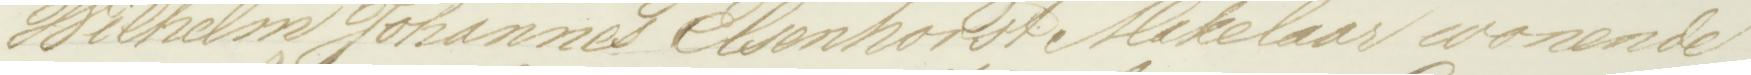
Wilhelm Johannes Elsenhorst Makelaar wonende
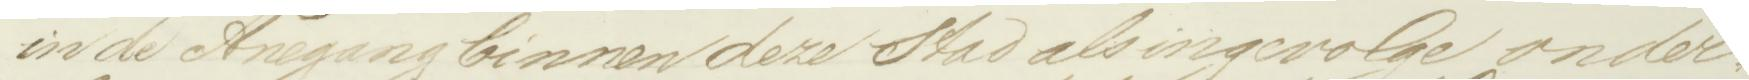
in de Anegang binnen deze stad als ingevolge onder„
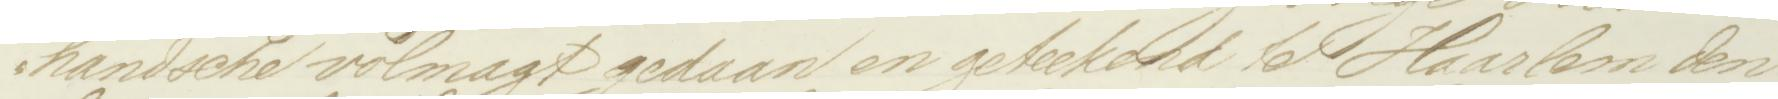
„handsche volmagt gedaan en geteekend te Haarlem den
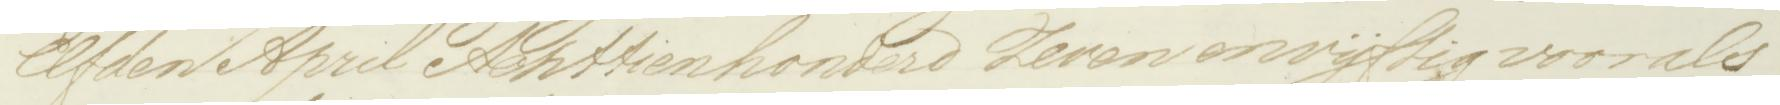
Elfden April Achttienhonderd Zeven envijftig voor als
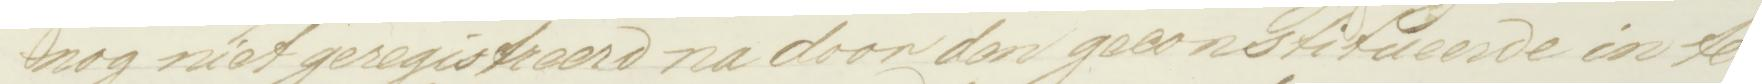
nog niet geregistreerd na door den geconstitueerde in te.
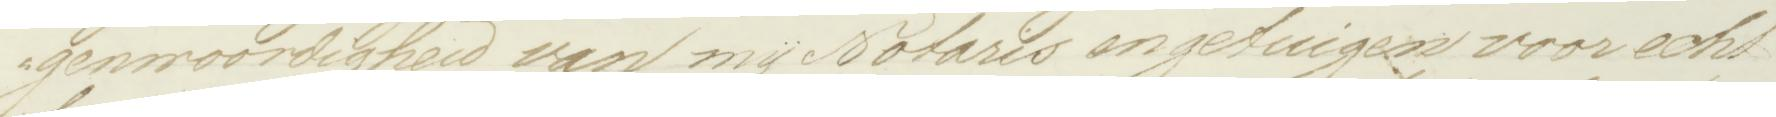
„genwoordigheid van mij Notaris en getuigen voor echt
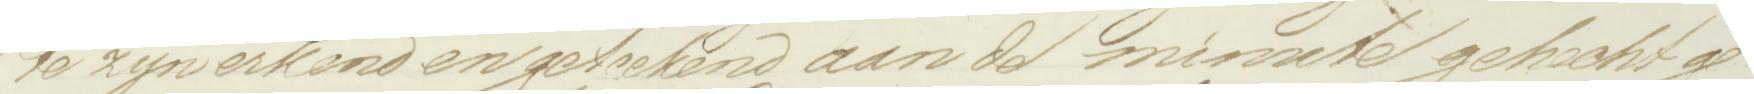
te zijn erkend en geteekend aan de minute gehecht ge
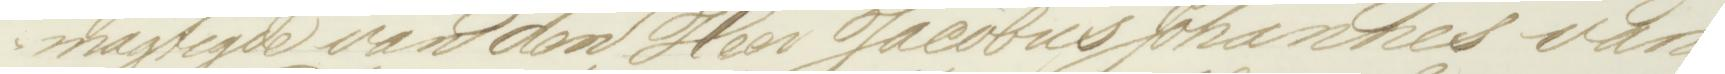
„magtigde van den Heer Jacobus Johannes van
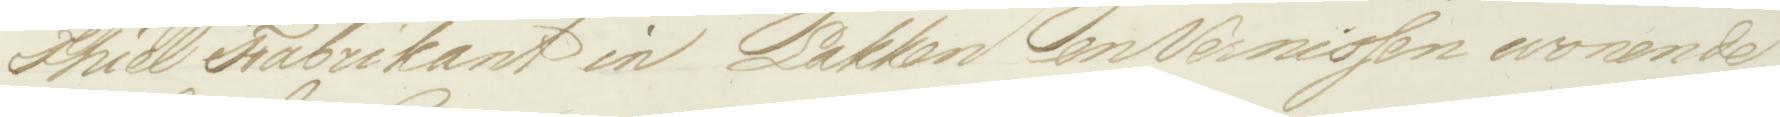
Thiel Fabrikant in Lakken en Vernissen wonende
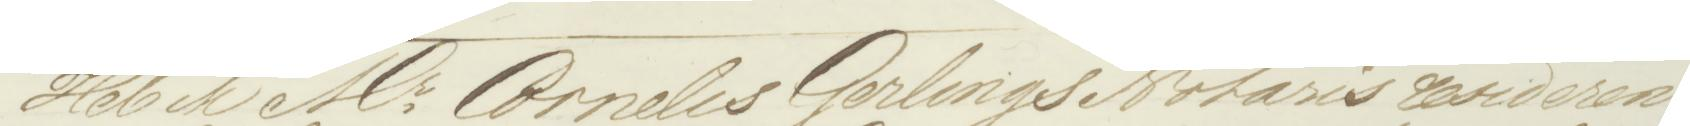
Heb ik M,r Cornelis Gerlings Notaris resideren.
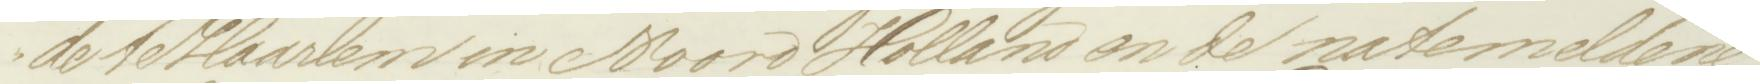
„de te Haarlem in Noord Holland en de natemeldene
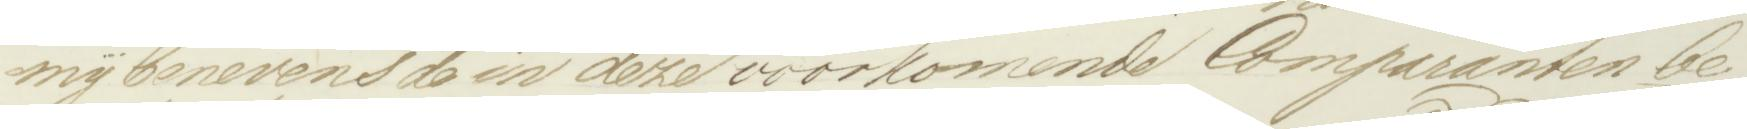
mij benevens de in deze voorkomende Comparanten be
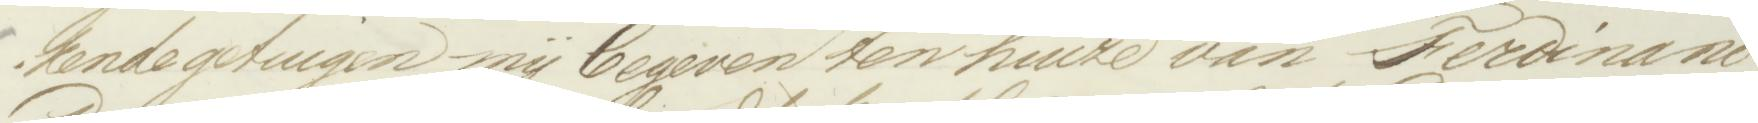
„kende getuigen mij begeven ten huize van Ferdinand
